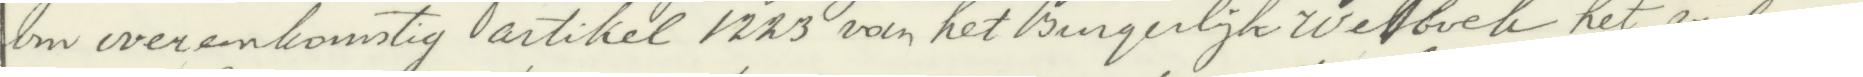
om overeenkomstig artikel 1223 van het Burgerlijk Wetboek het verbon-
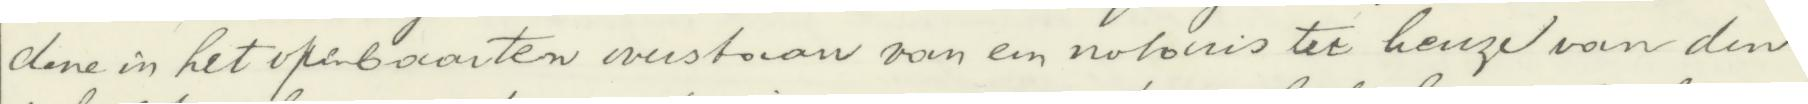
dene in het openbaar ten overstaan van een notaris ter keuze van den
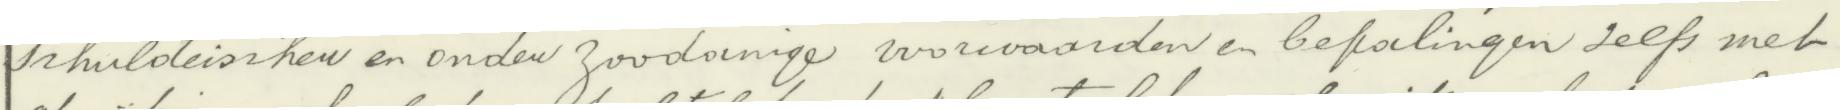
schuldeischer en onder zoodanige voorwaarden en bepalingen zelfs met
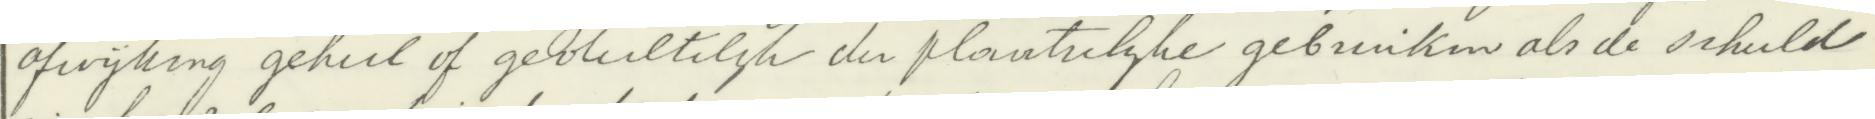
afwijking geheel of gedeeltelyk der plaatselyke gebruiken als de schuld
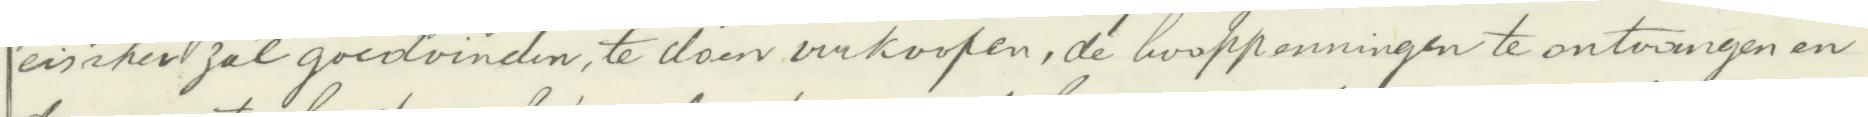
eischer zal goedvinden, te doen verkoopen, de kooppenningen te ontvangen en
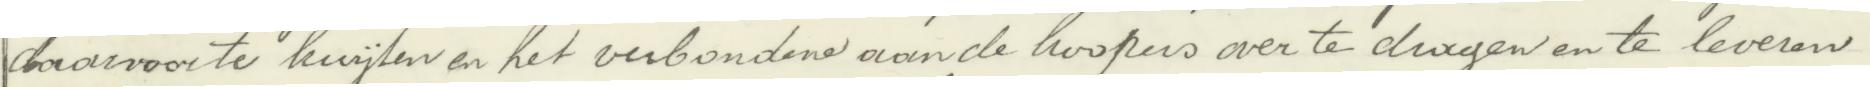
daarvoor te kwijten en het verbondene aan de koopers over te dragen en te leveren
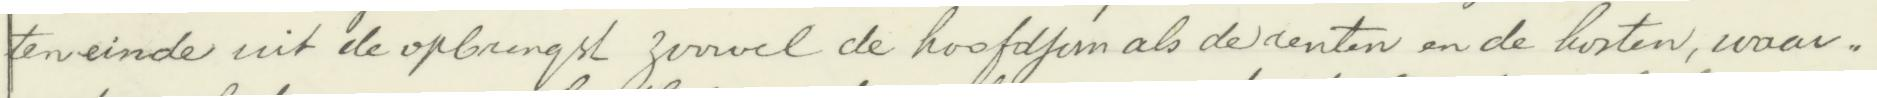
ten einde uit de opbrengst zoowel de hoofdsom als de renten en de kosten, waar„
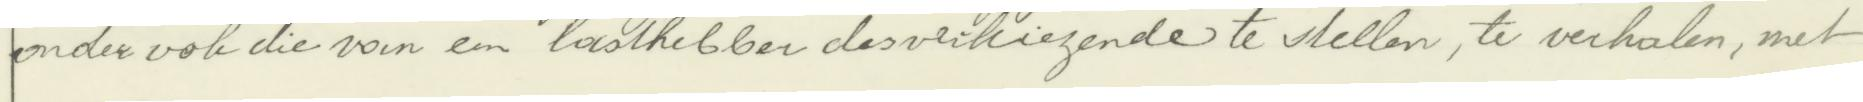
onder ook die van een lasthebber des verkiezende te stellen, te verhalen, met
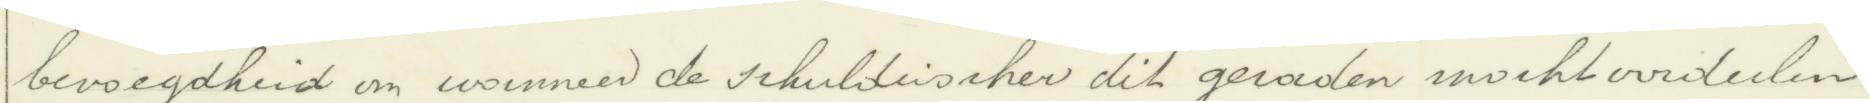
bevoegdheid om wanneer de schuldeischer dit geraden mocht oordeelen
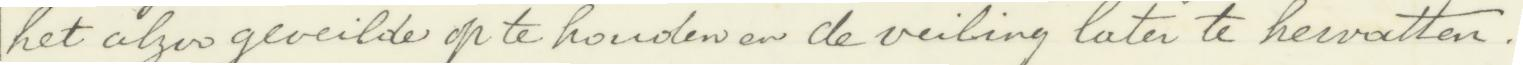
het alzoo geveilde op te houden en de veiling laten te hervatten.
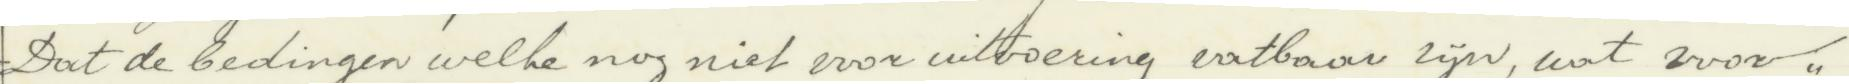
Dat de bedingen welke nog niet voor uitvoering vatbaar zijn, wat voor„
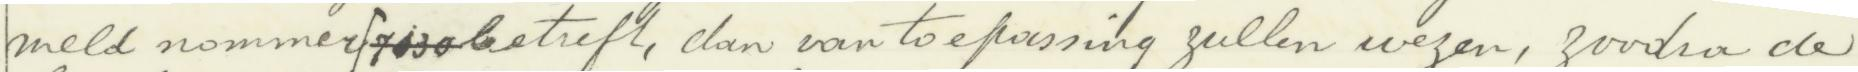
meld nommer ¶ 7130 betreft, dan van toepassing zullen wezen, zoodra de
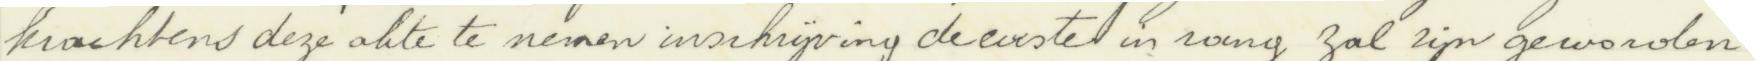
krachtens deze akte te nemen inschrijving de eerste in rang zal zijn geworden
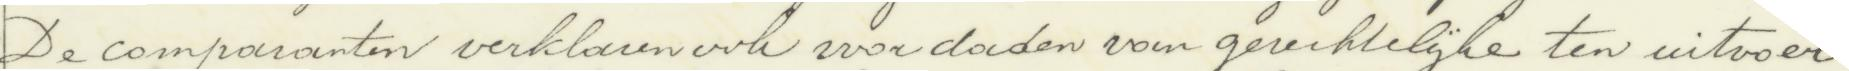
De comparanten verklaren ook voor daden van gerechtelijke ten uitvoer
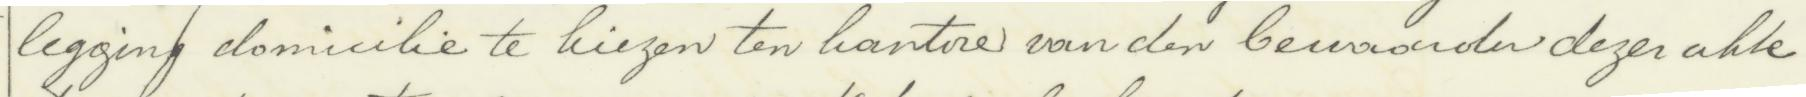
legging domicilie te kiezen ten kantore van den bewaarder dezer akte
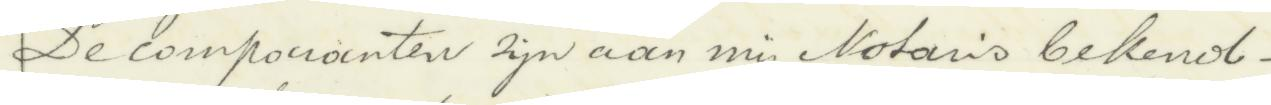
De comporanten zijn aan mij Notaris bekend
